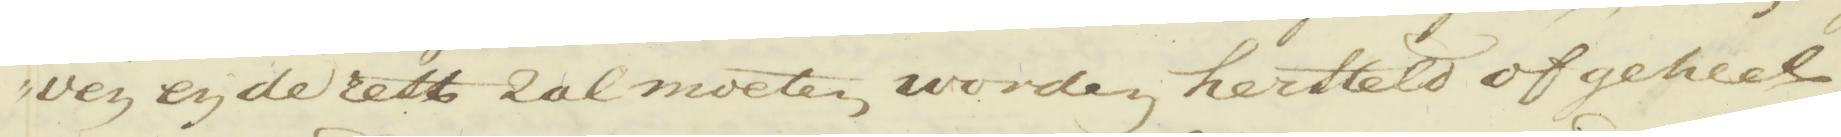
„ven en de rest zal moeten worden hersteld of geheel
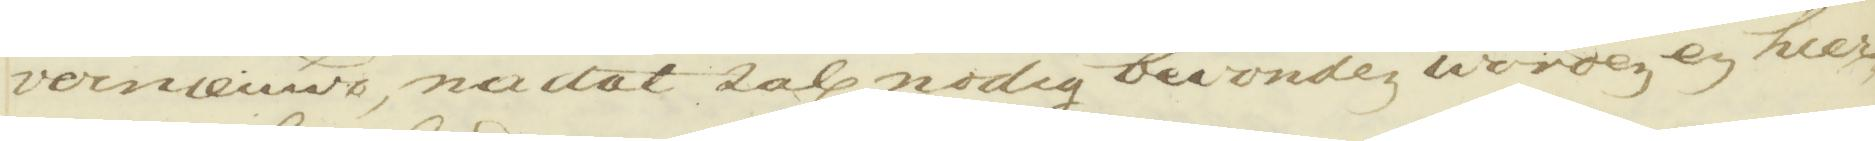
vernieuwd, nadat zal nodig bevonden worden en hier„
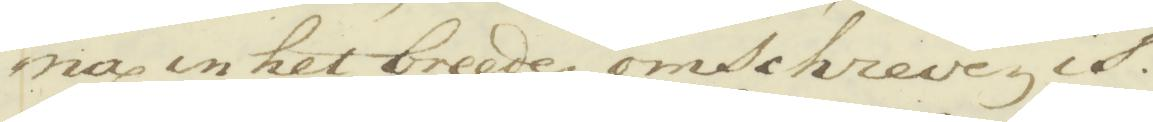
na in het breeder omschreven is.
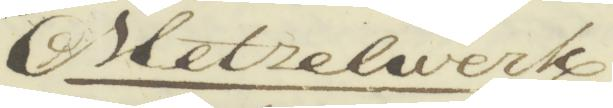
Metzelwerk
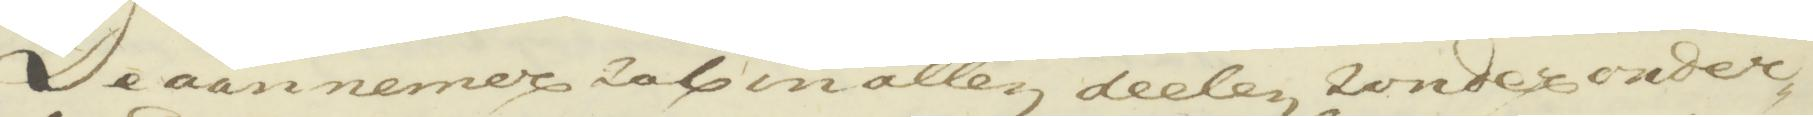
De aannemer zal in allen deelen zonder onder„
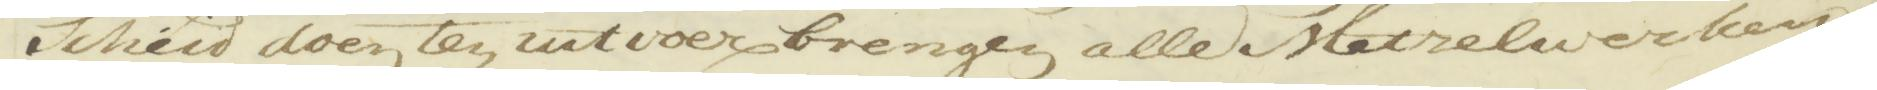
scheid doen ten uitvoer brengen alle Metzelwerken
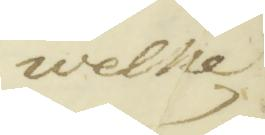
welke
